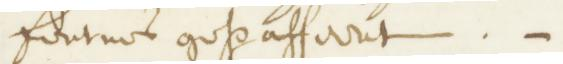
fortres gepasseert. -
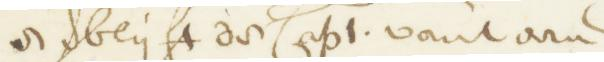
en verblijft de Capt. van’t eene
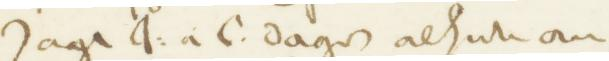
Jagt 4: â 5. dagen alhier om
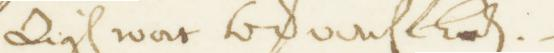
zigh wat te ververschen.
